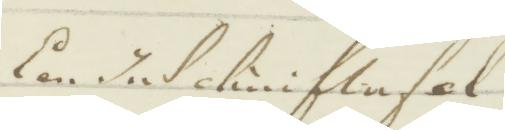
Een Inschuiftafel
